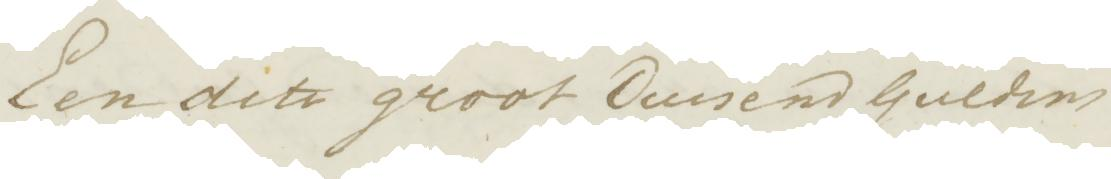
Een dito groot Duisend Guldens
